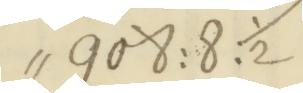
„ 908:8½
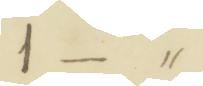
1 — „
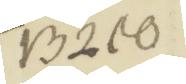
13250
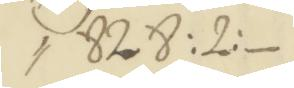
„ 82.8:2:—
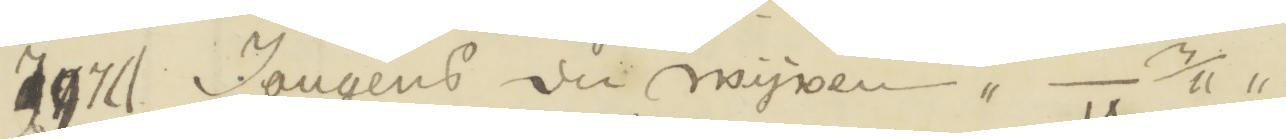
7974. Iongens en wijven „ — ¾ „
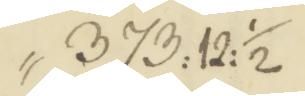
„ 373:12½
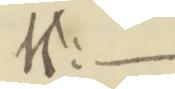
15: —
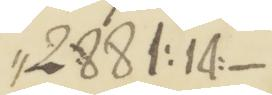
„2881:14:—
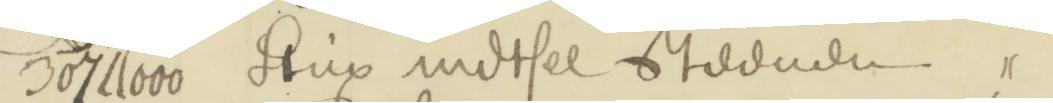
3074000 stux metsel steenen „
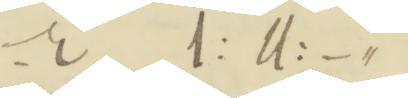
r 1: 4:— „
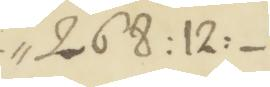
„268:12:—
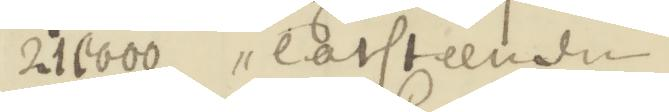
215000 „ latsteenen
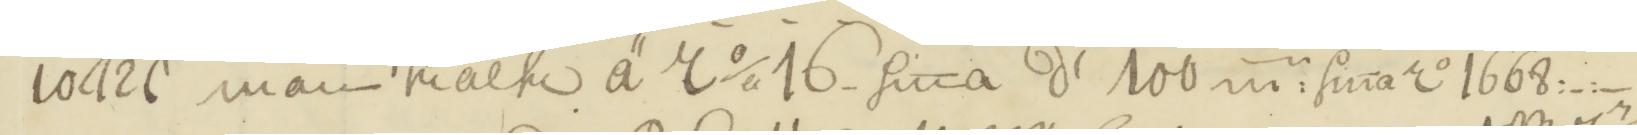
10425 man kalk â r:o/a 16. sirca d’ 100 m:r sirca r:o 1668:- :–
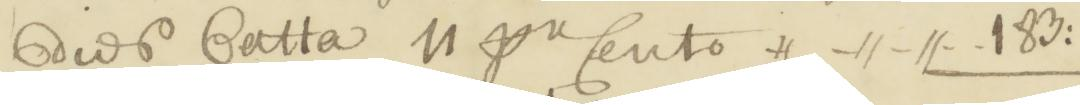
dies batta 11 pr Cento „ -„ - „ 183:7 7/15
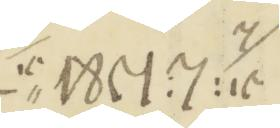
„ 1851.7: 7/15
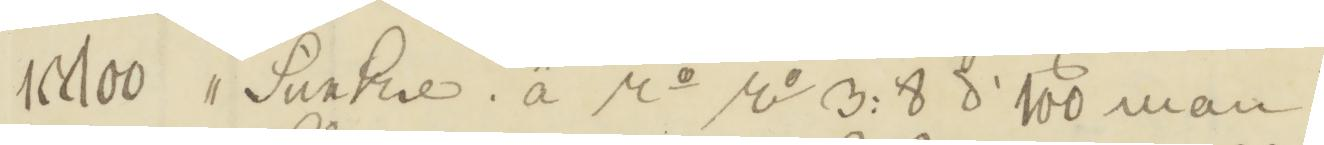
15400 „ Surkie. â r=o r=o 3: 8 d' 100 man
